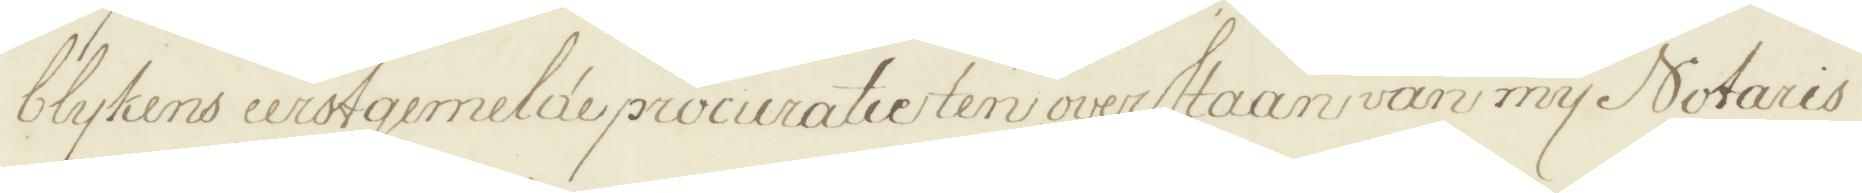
blykens eerstgemelde procuratie ten overstaan van my Notaris
